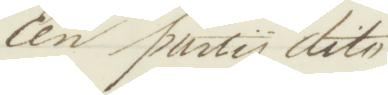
Een partij dito
